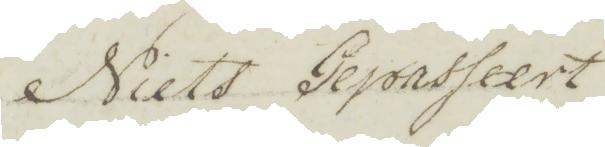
Niets Gepasseert
